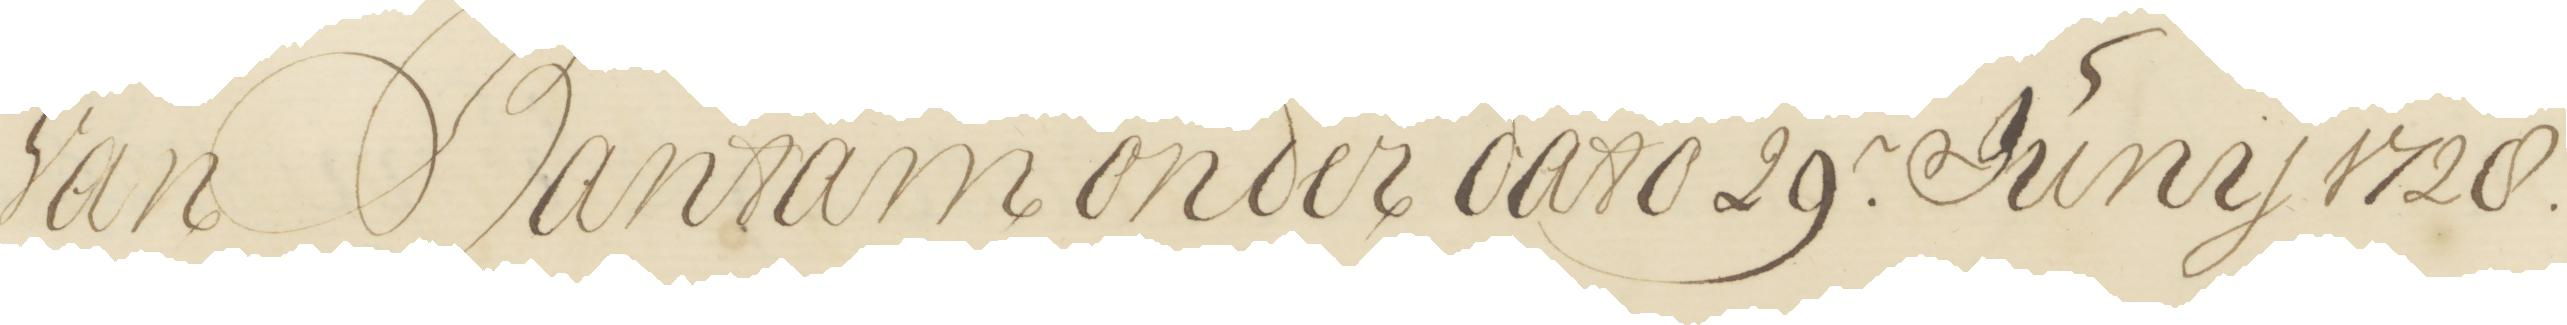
Van Bantam onder dato 29.e Iunij 1728.
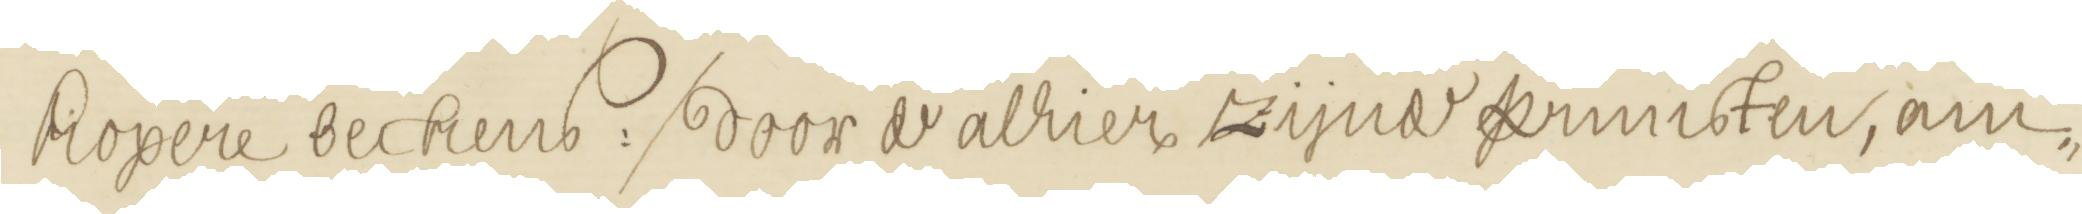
kopere beckens:/ door de alhier zijnde permisten, am„
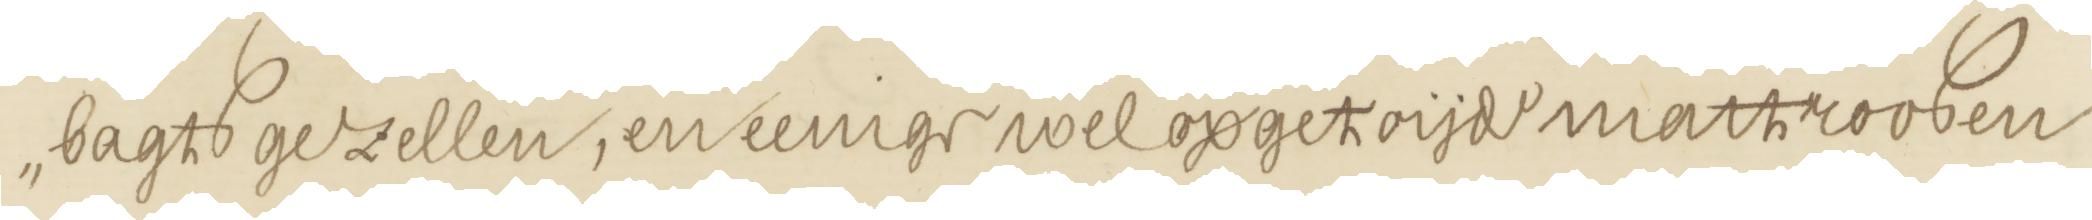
„bagts gezellen, en eenige wel opgetoijde mattroosen
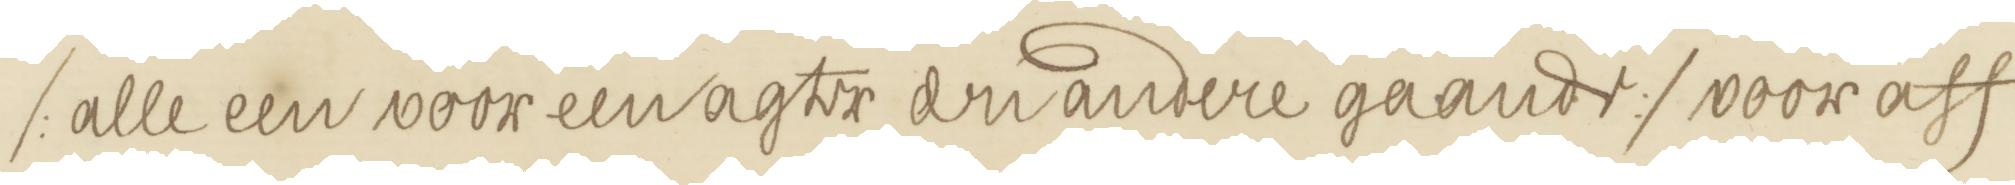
/: alle een voor een agter den andere gaande:/ voor aff
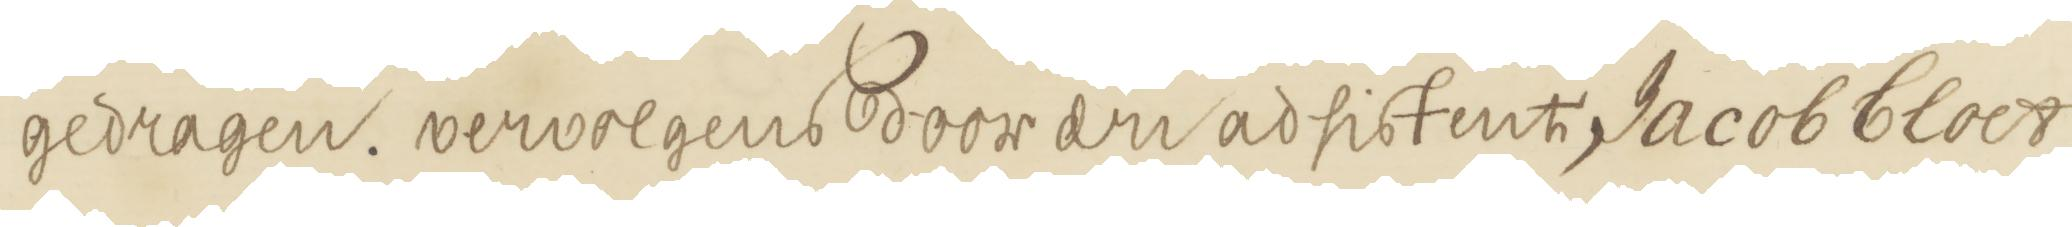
gedragen. vervolgens door den adsistent, Iacob Bloet
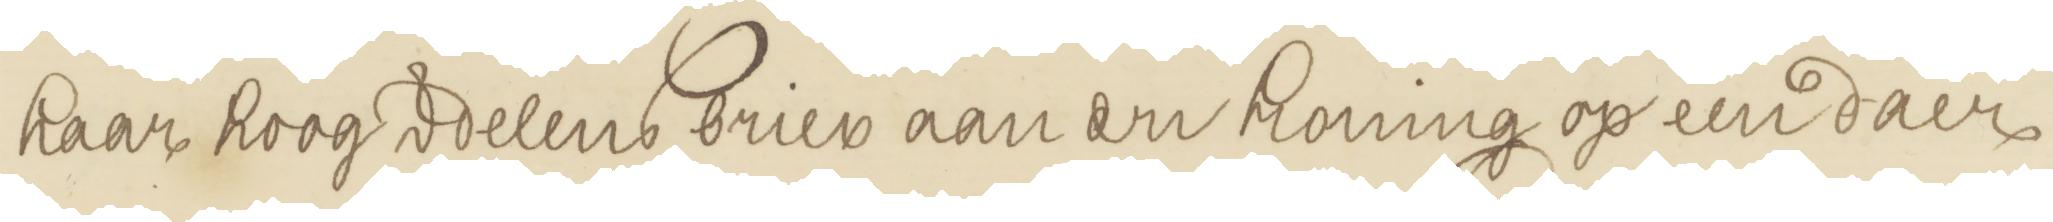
haar hoog Edelens briev aan den koning op een daer
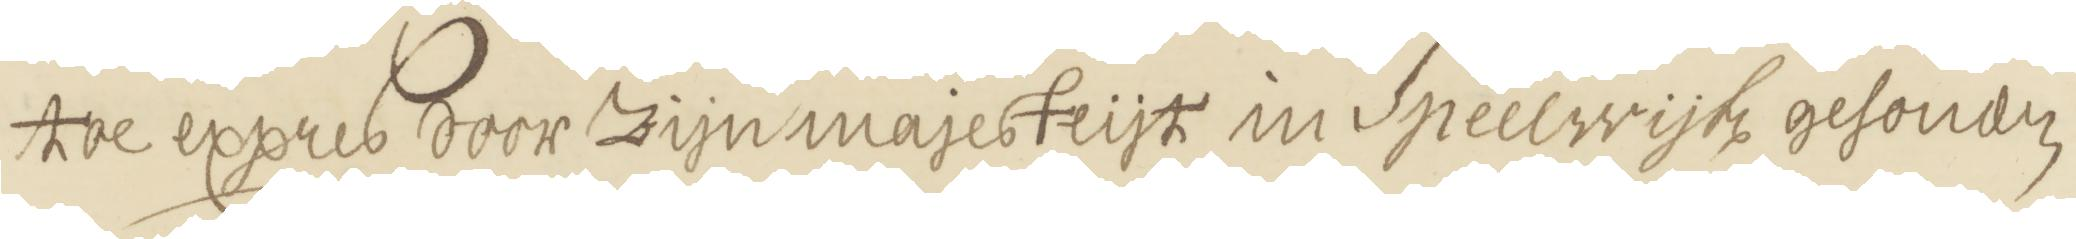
toe expres door zijn majesteijt in Speelwijk gesonden
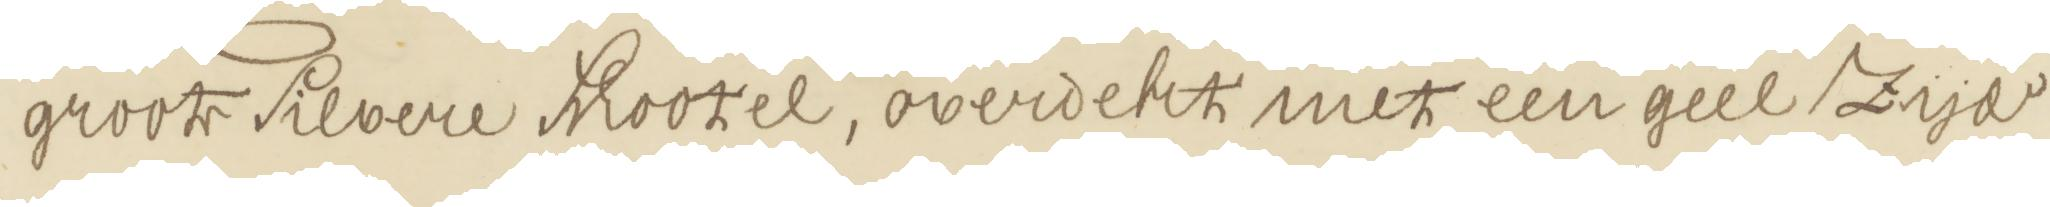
groot silvere schootel, overdekt met een geel Zijde
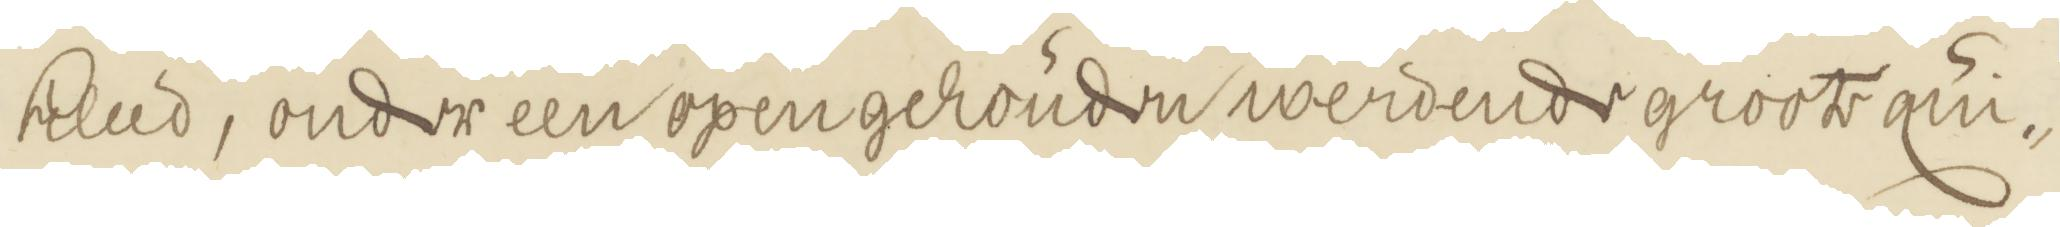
kleed, onder een open gehouden werdende groote qui„
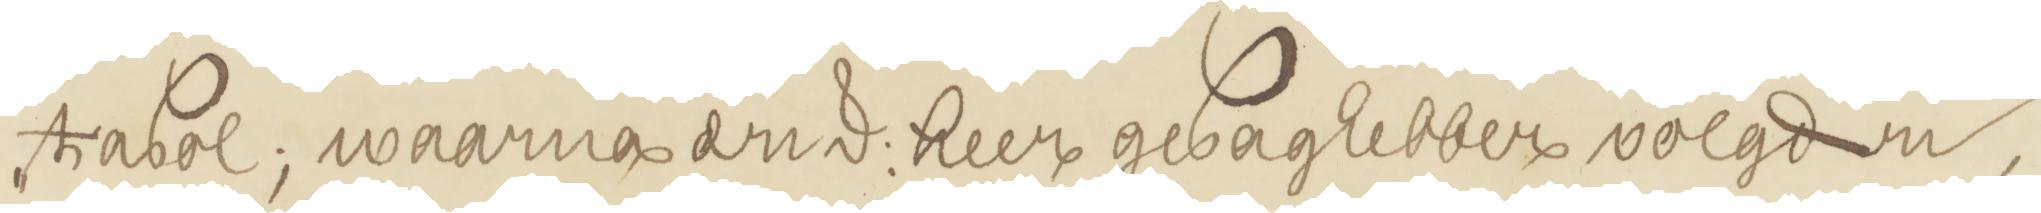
„tasol; waarna den E: heer gesaghebber volgden,
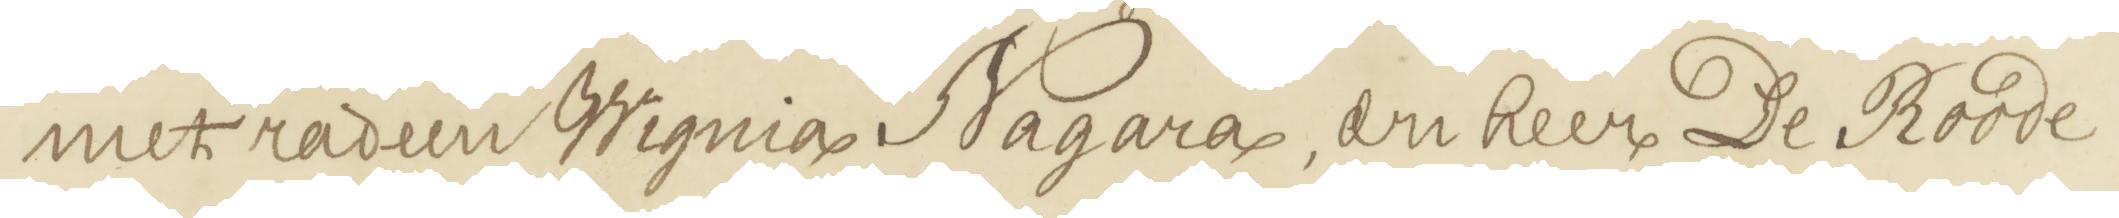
met radeen Wignia Nagara, den heer De Roode
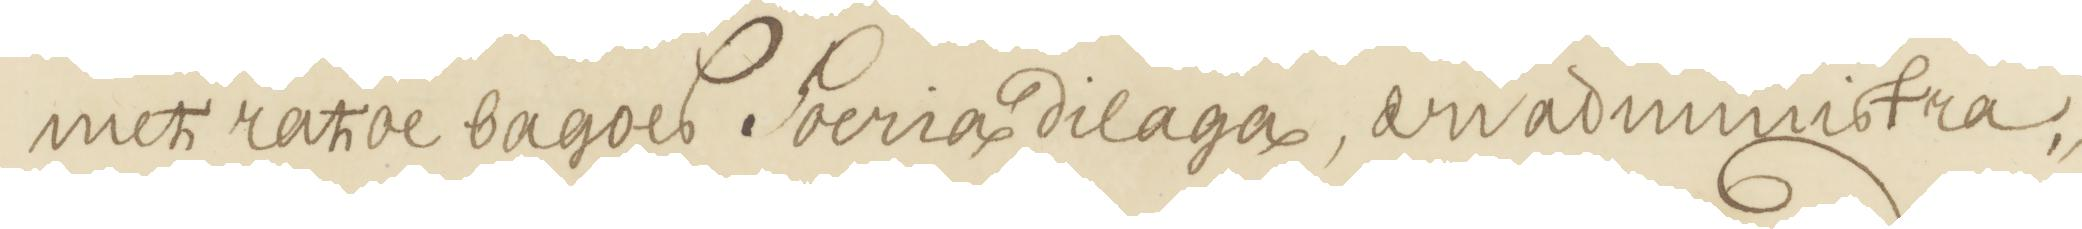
met ratoe bagoes Soeria dilaga, den administra„
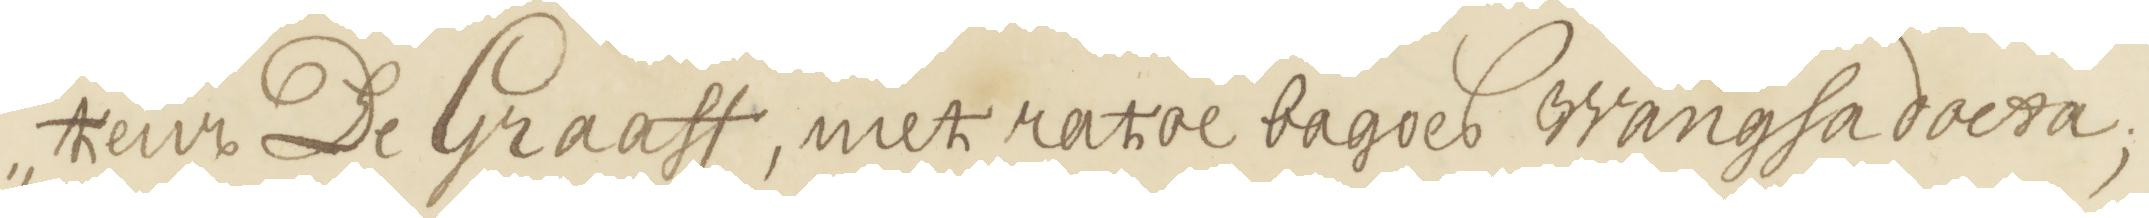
„teur De Graaff, met ratoe bagoes Wangsa doeta;
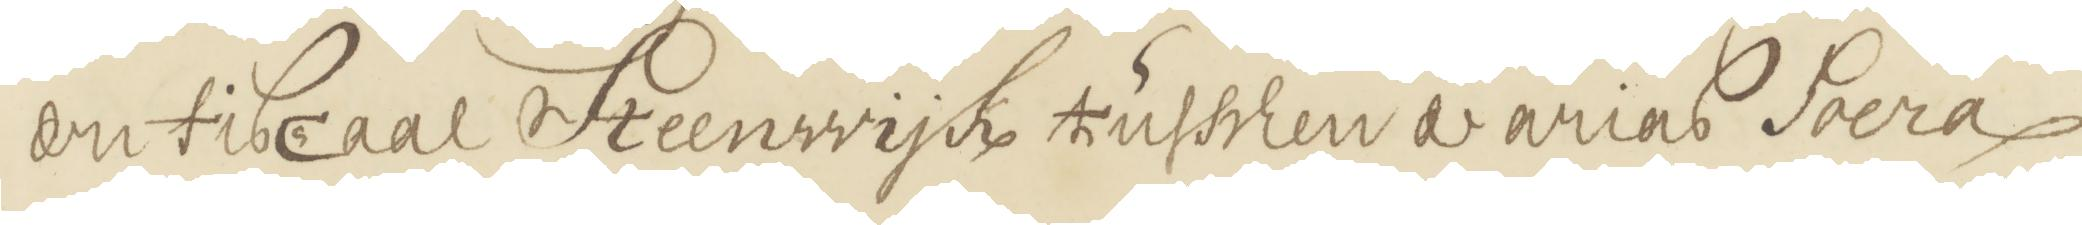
den fiscaal Steenwijk tusschen de arias Soera
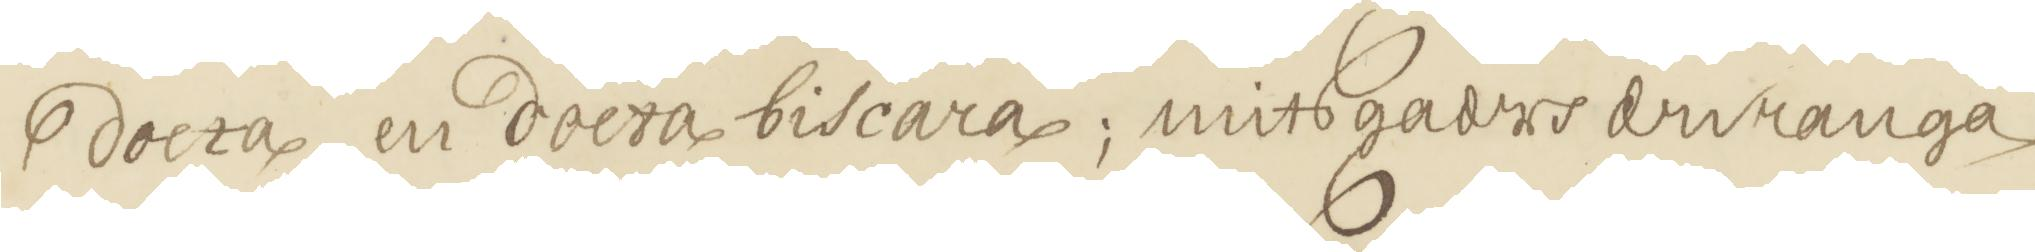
doeta, en doeta biscara; mitsgaders den ranga
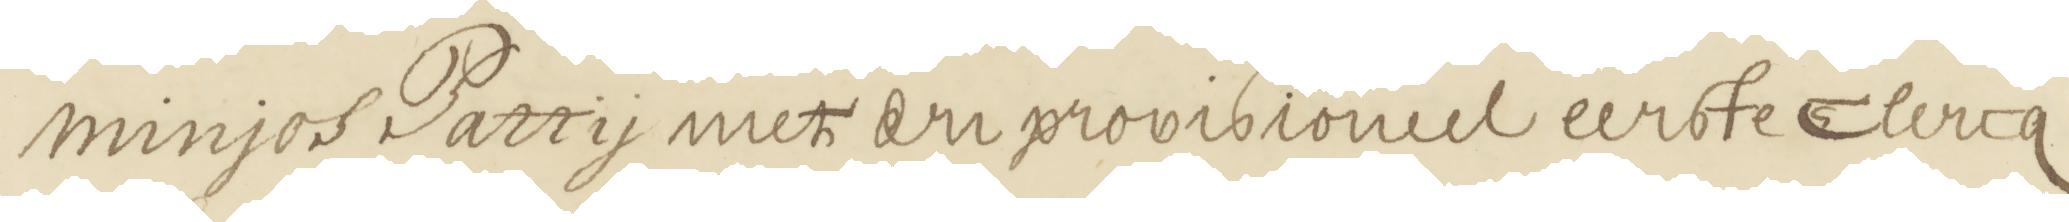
minjos Pattij met den provisioneel eerste clercq
